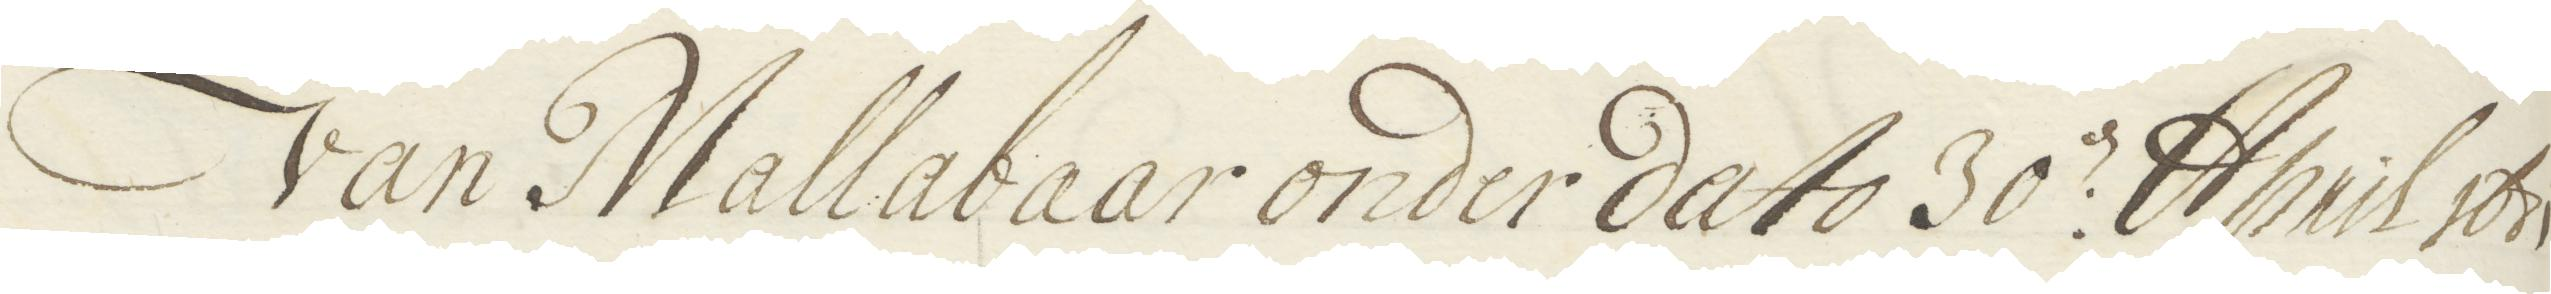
Van Mallabaar onder dato 30:en April 1681
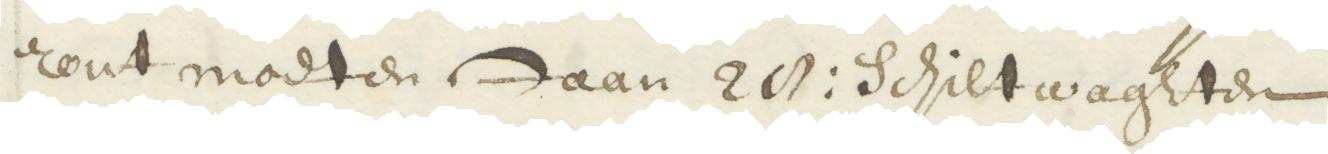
ront moeten staan 28: schiltwaghten
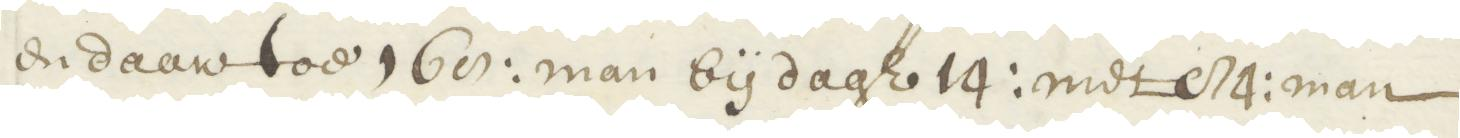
en daar toe 168: man bij dagh 14: met 84: man
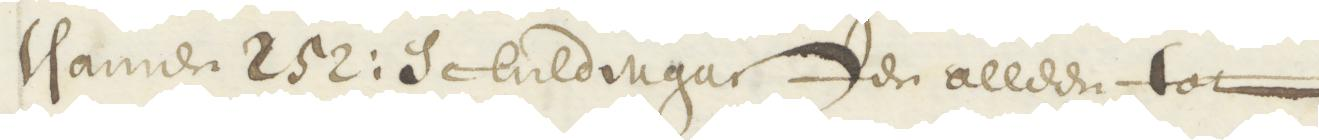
tsamen 252: schildergaster alleen tot
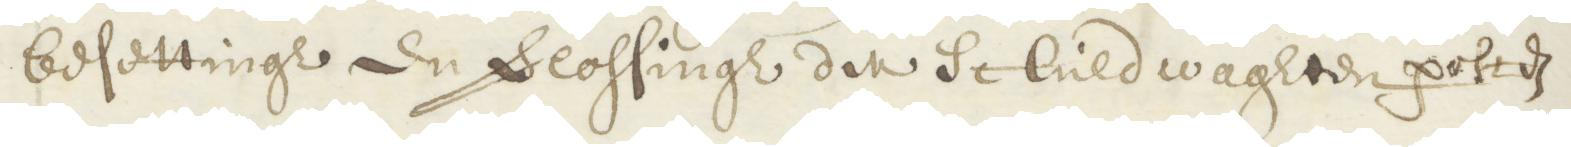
besettingh en verlossingh der schildwaghten posten
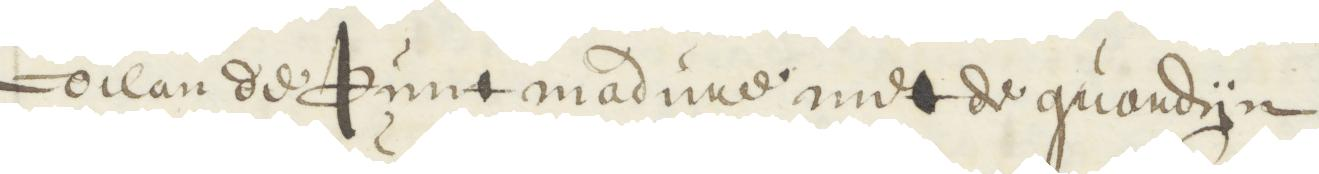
coilan de punt madure met de guardijn
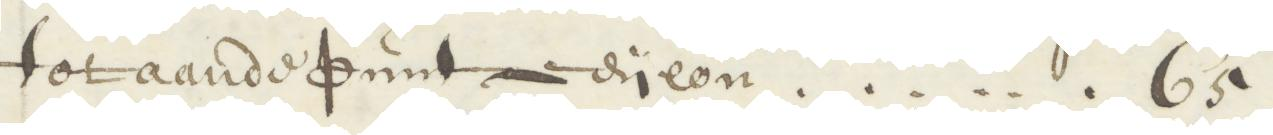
tot aande punt ceijlon . . - - - . 65
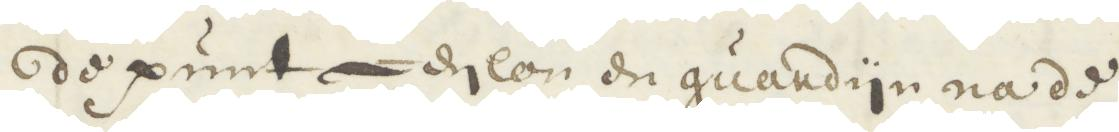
de punt ceijlon en guardijn na de
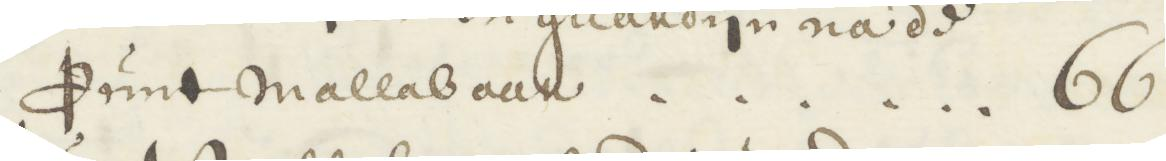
punt mallabaar . . . . . . 66
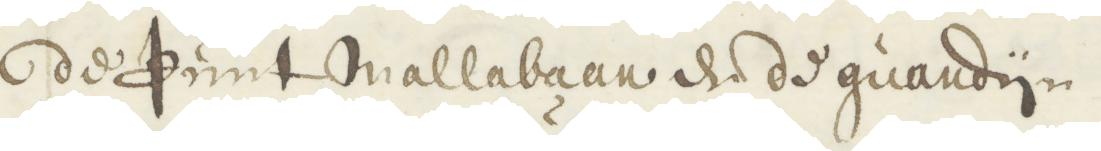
de punt mallabaar en de guardijn
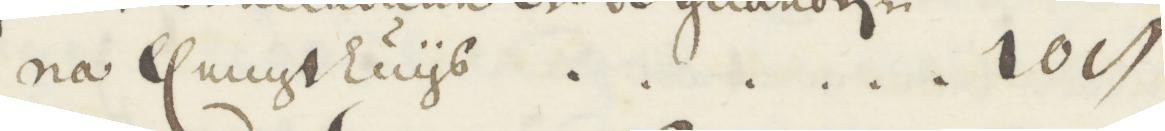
na Gruythuijs . . . . . . 108
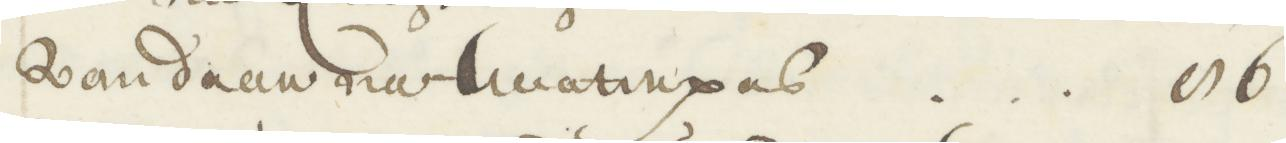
van daar na twaterpas . . . 86
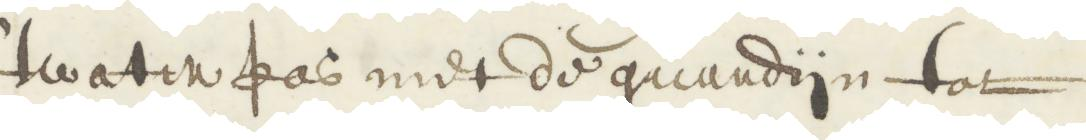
'twaterpas met de guardijn tot
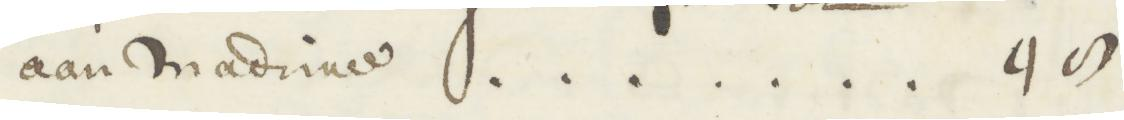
aan madure . . . . . . . 48
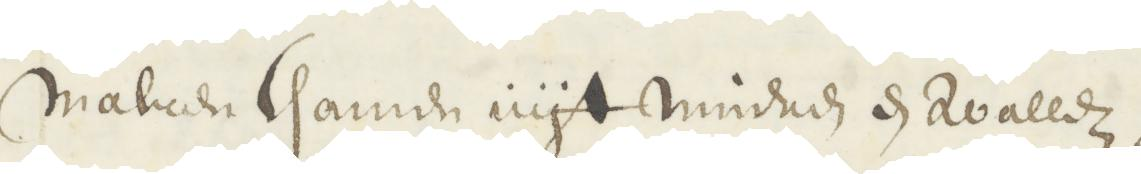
maken tsamen uijt mueren en wallen
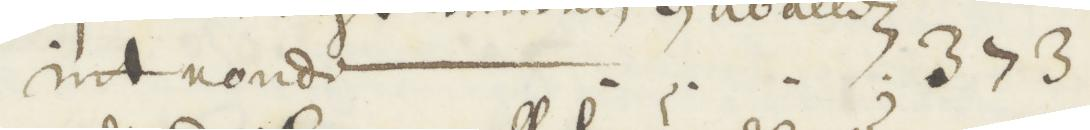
int ronde . . . . 373
